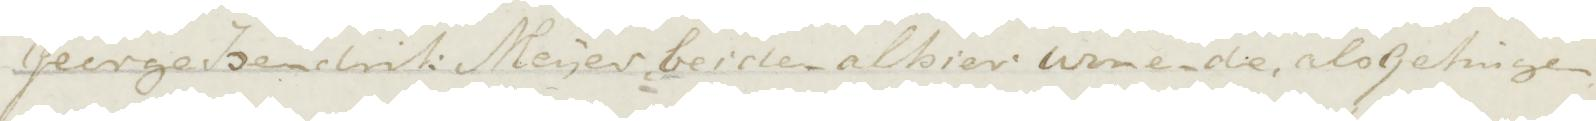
George Hendrik Meijer, beiden alhier wonende, als Getuigen
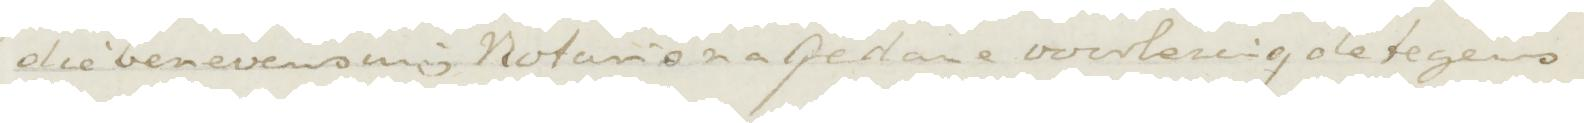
die benevens mij Notaris na gedane voorlezing de tegens
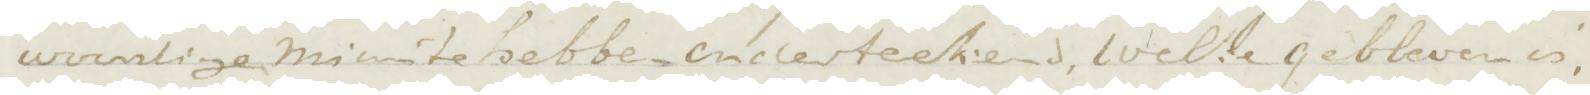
woordige Minute hebben onderteekend, welke gebleven is,
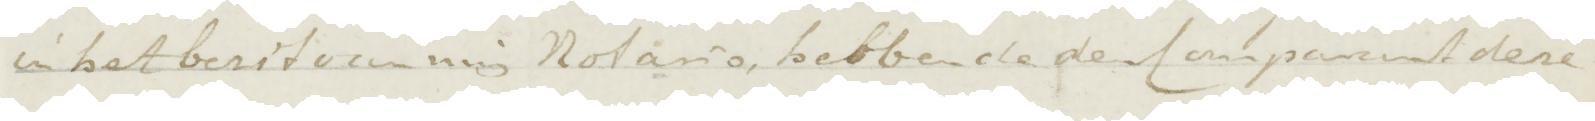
in het bezit van mij Notaris, hebbende den Comparant deze
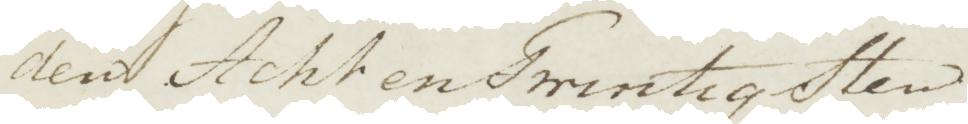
den Acht en Twintigsten
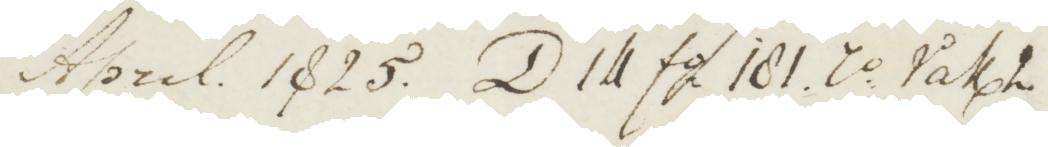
April. 1825. D 14 fol 181. r:o Vak 2
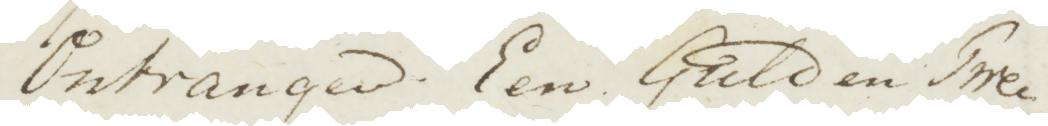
Ontvangen. Een Gulden Twee
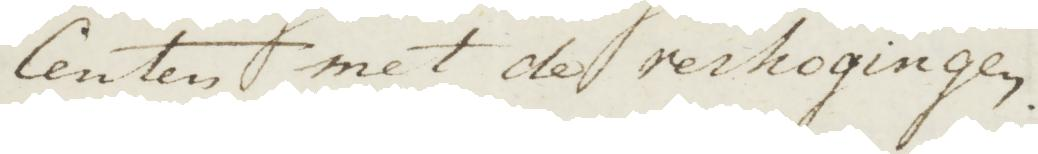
Centen met de verhogingen.
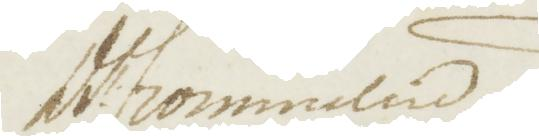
DF: Crommelin
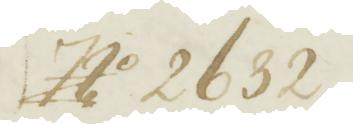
No 2632
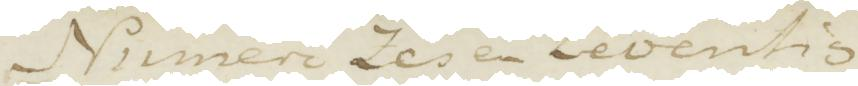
Numero Zes en Zeventig
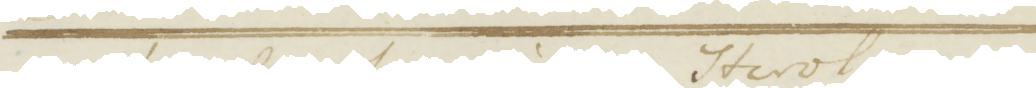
verbaale verkoopinge van Horologien
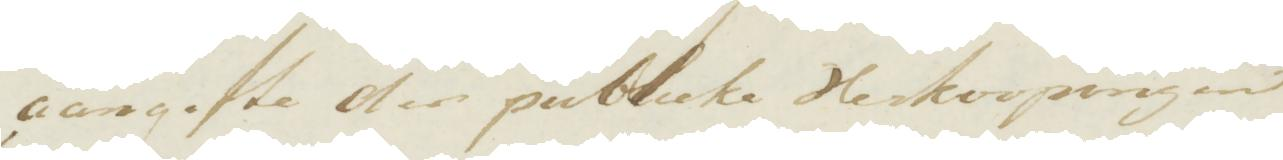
aangifte der publieke Verkoopingen
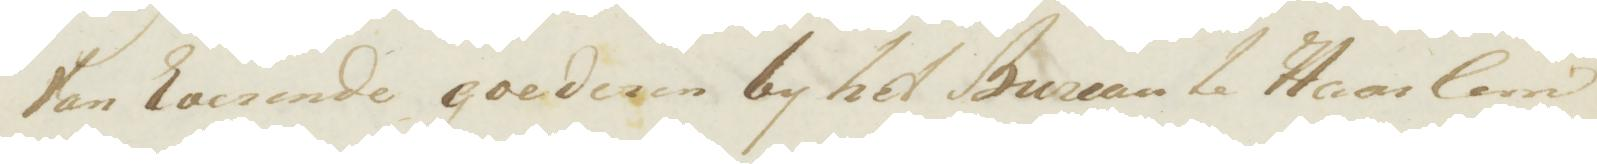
van roerende goederen by het Bureau te Haarlem
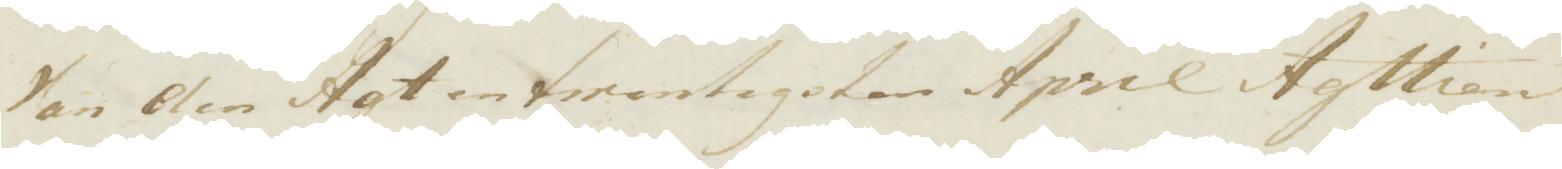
Van den Agt en twintigsten April Agttien
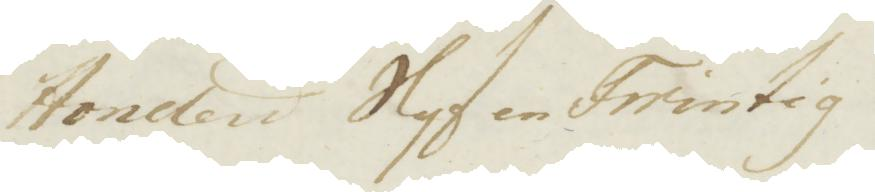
Honderd Vyf en Twintig
